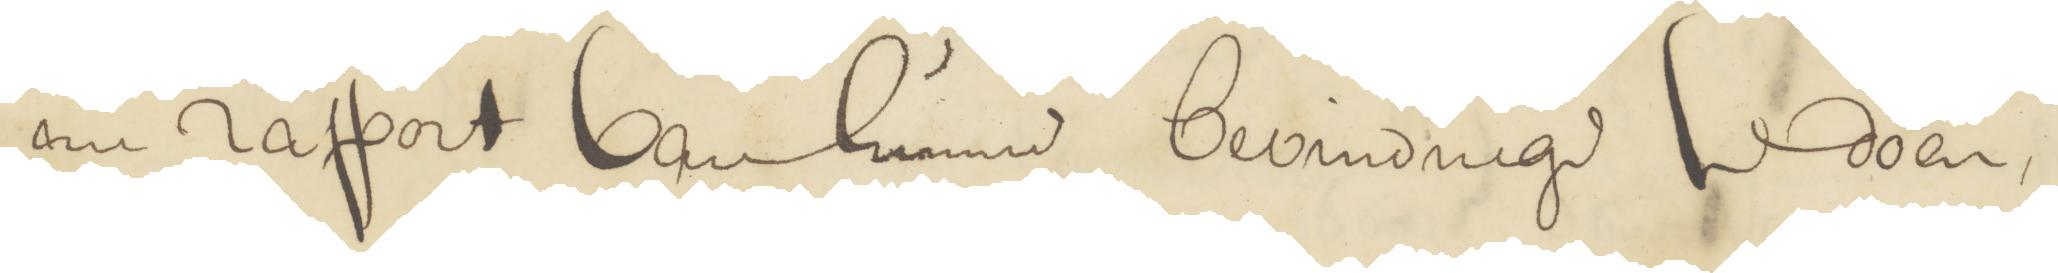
om rapport van hunne bevindinge te doen,
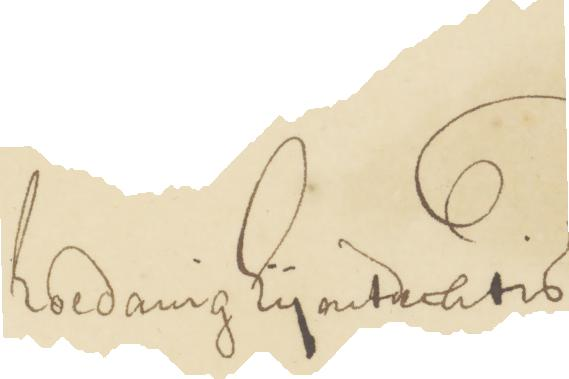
hoedanig hij ontdeckt is
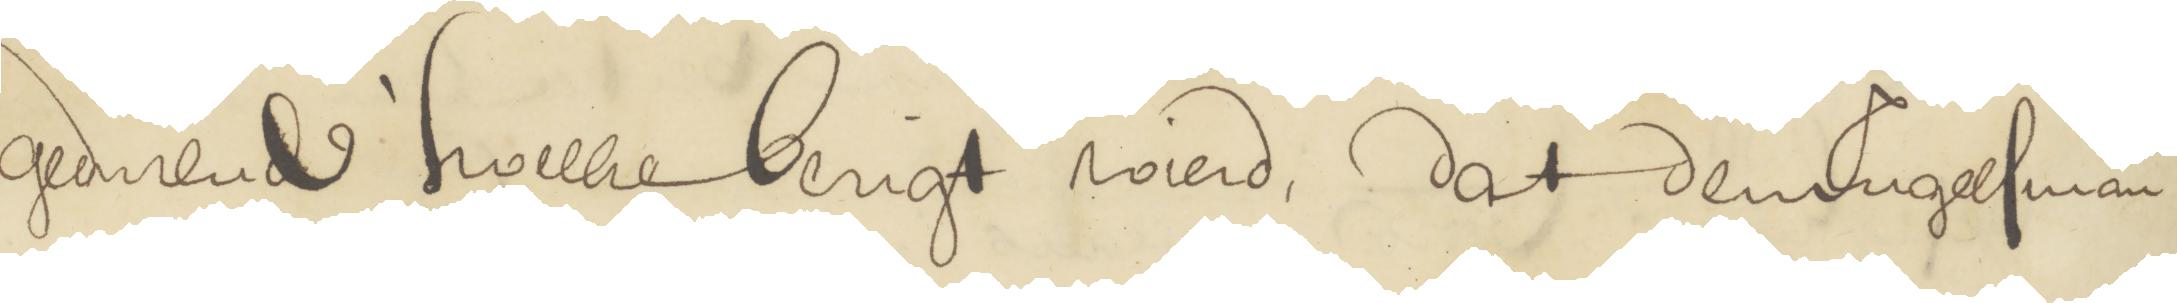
gedurende 'twelke berigt wierd, dat den Engelsman
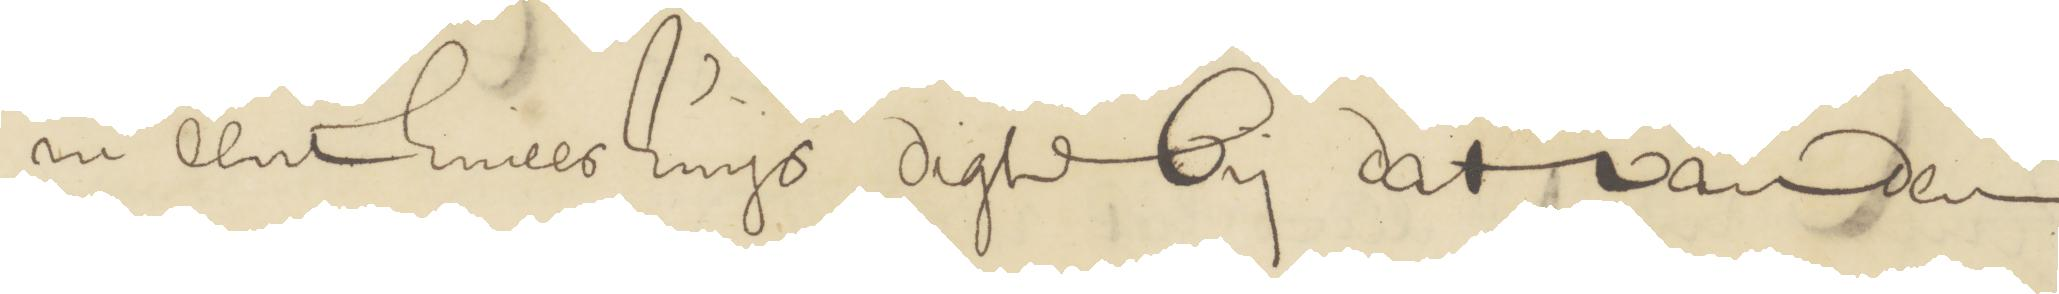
in een Chinees huijs digtebij dat van den
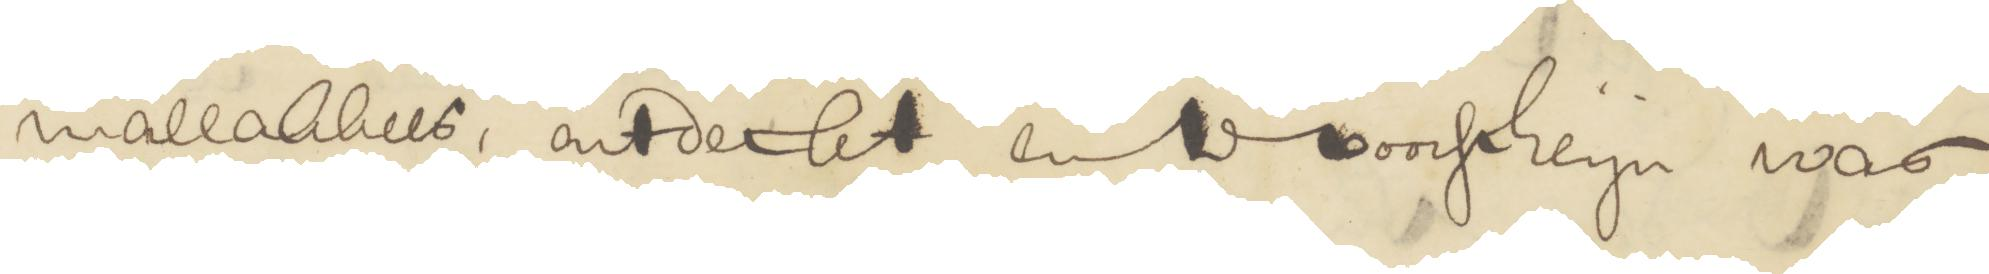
mallakkees, ontdeckt en te voorscheijn was
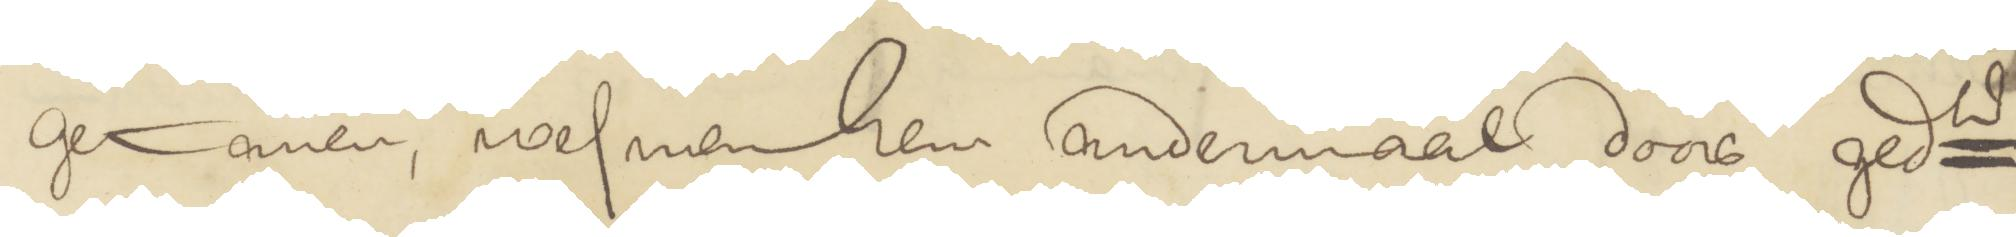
gecomen, wes men hem andermaal door ged=te
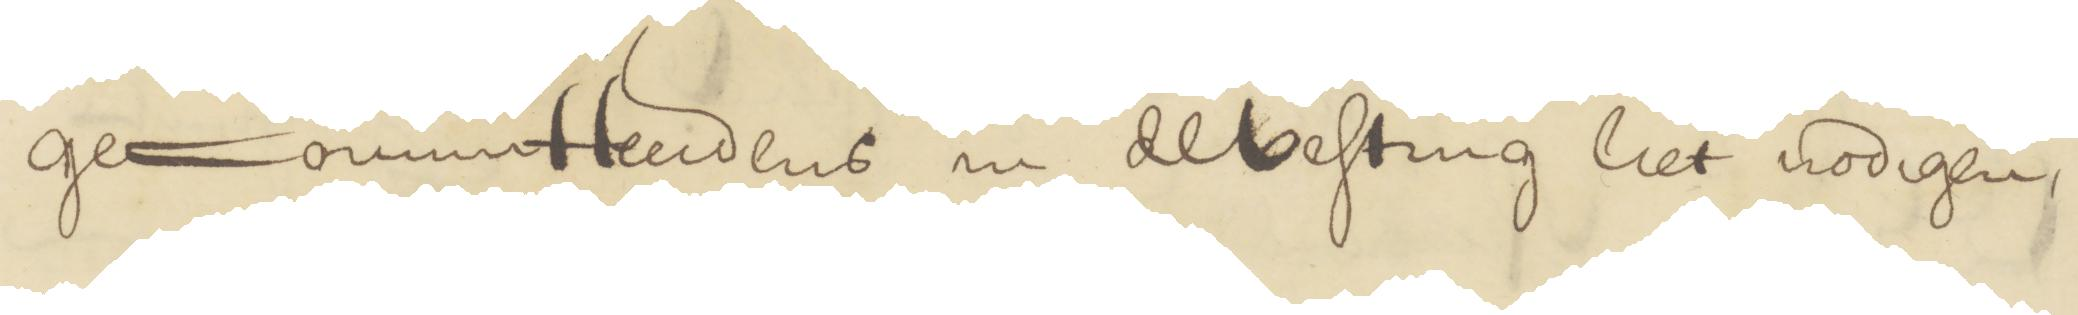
gecommitteerdens in de vesting liet nodigen,
